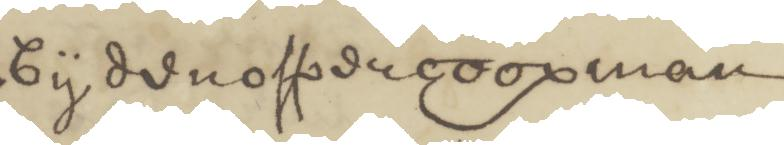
bij den oppercoopman
